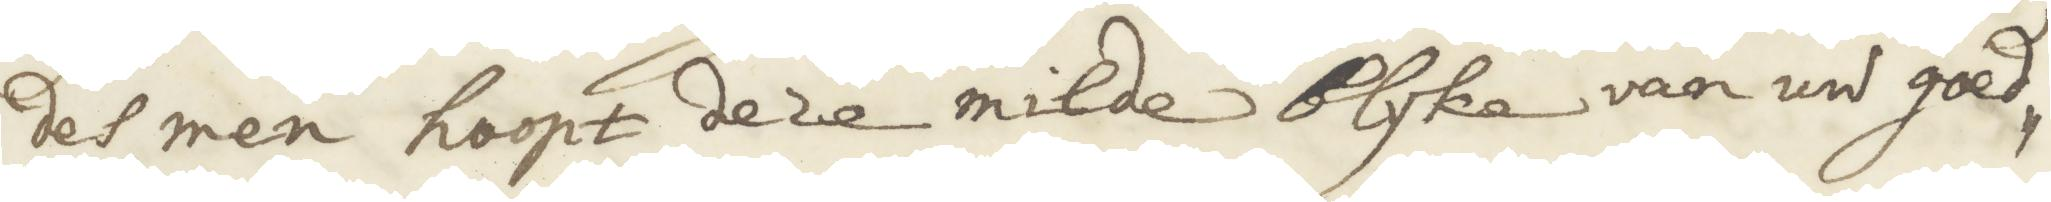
des wen hoopt deze milde blyke van uw goed„
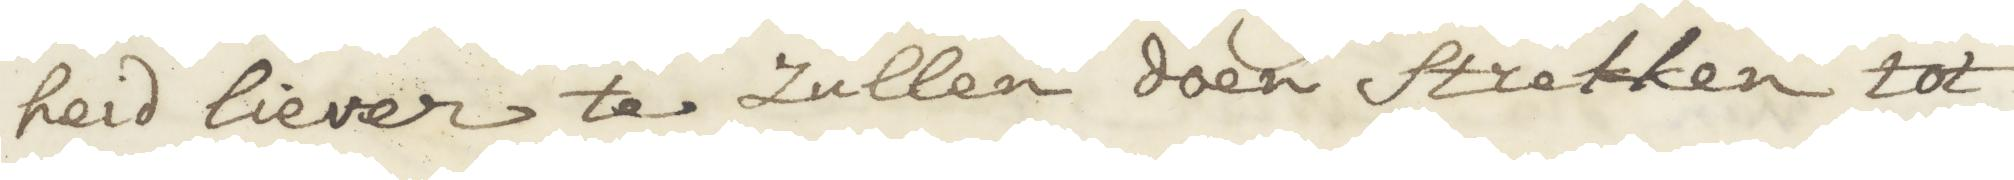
heid liever te zullen doen strekken tot
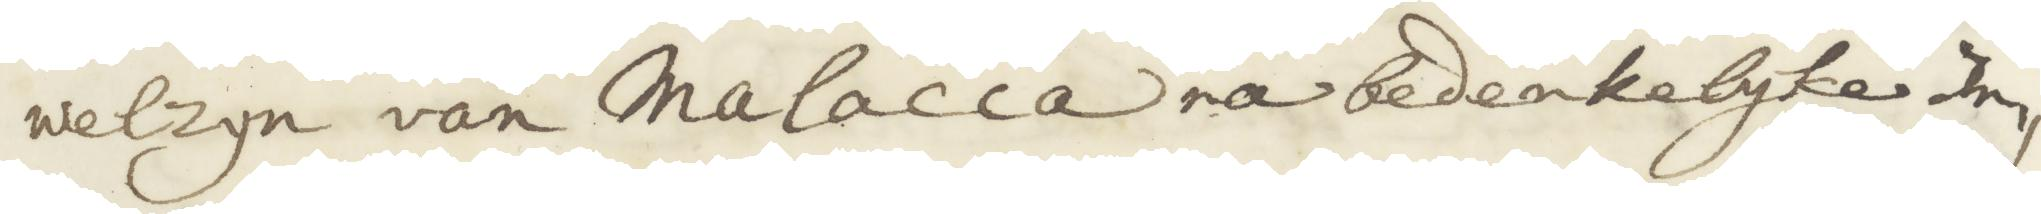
welzyn van malacca na bedenkelyke jn
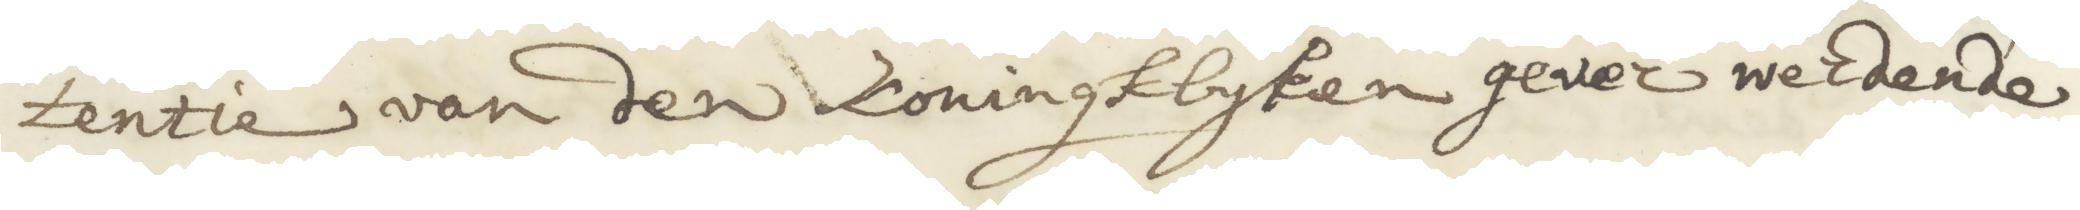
tentie van den koningklyken gever werdende
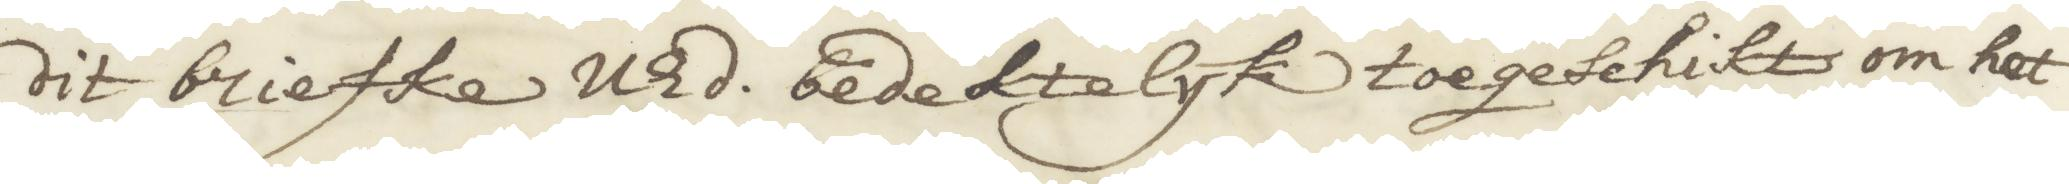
dit briefke uEd. bedektelyk toegeschikt om het
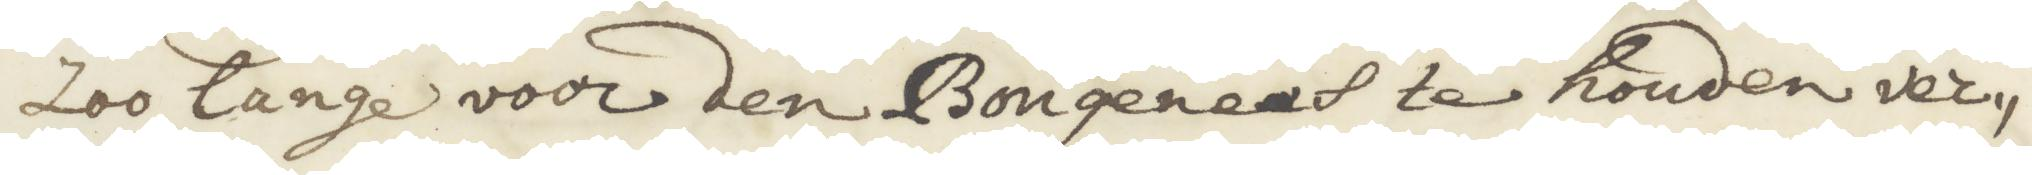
zoo lange voor den Bougenees te houden ver„
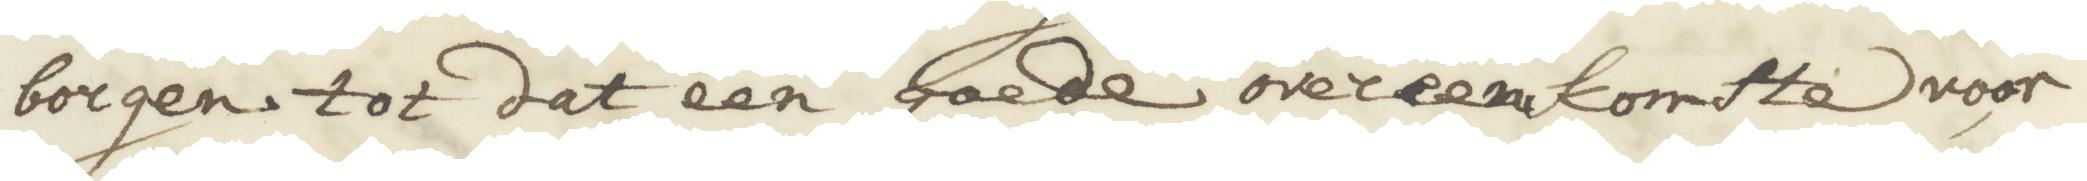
borgens tot dat een goede overeenkomste voor
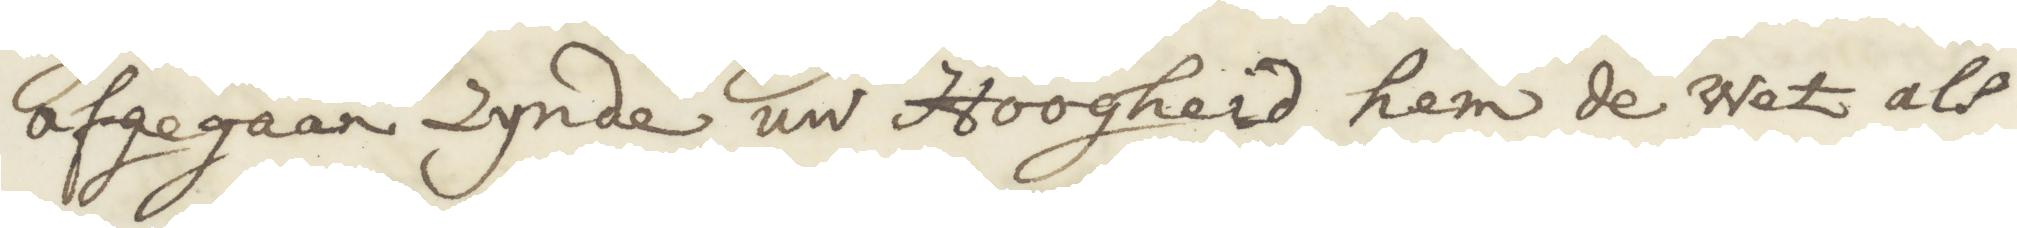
afgegaan zynde uw Hoogheid hem de wet als
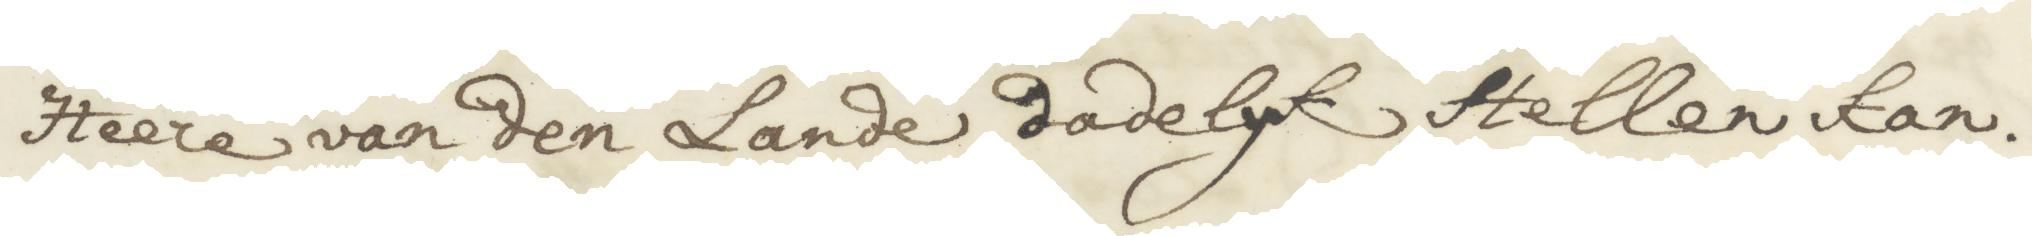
Heere van den lande dadelyk stellen kan.
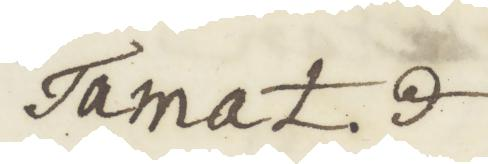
Tamat.
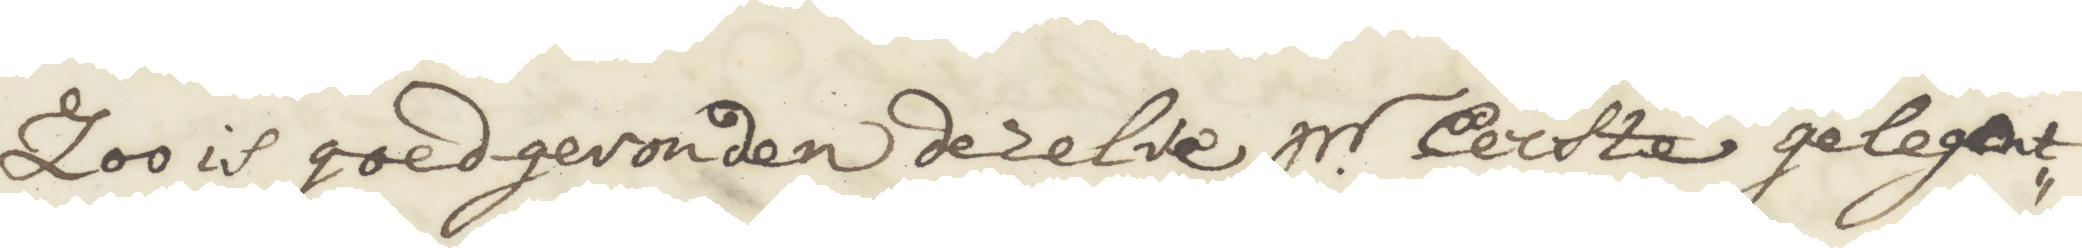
Zoo is goed gevonden dezelve p.r Eerste gelegent„
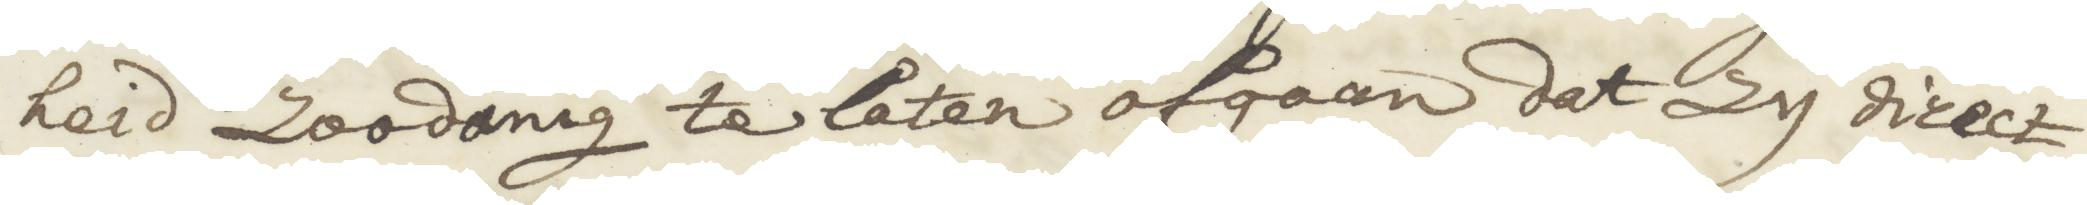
heid zoodanig te laten afgaan dat zy direct
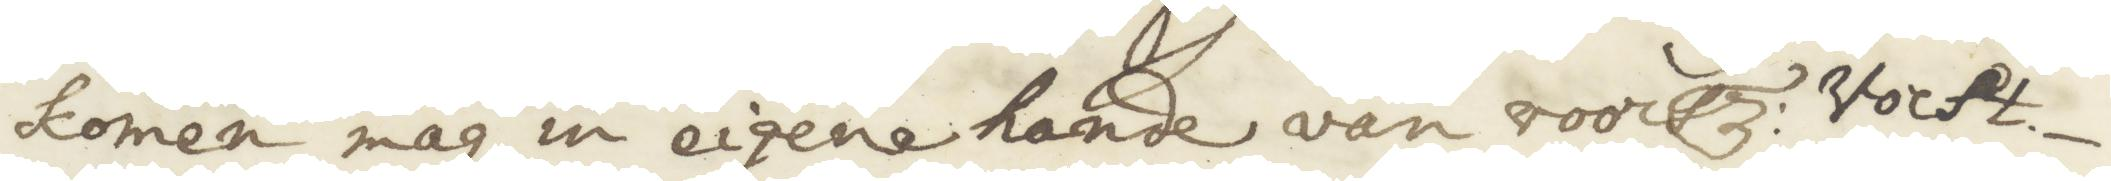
komen mag in eigene hande van voorz: vorst.
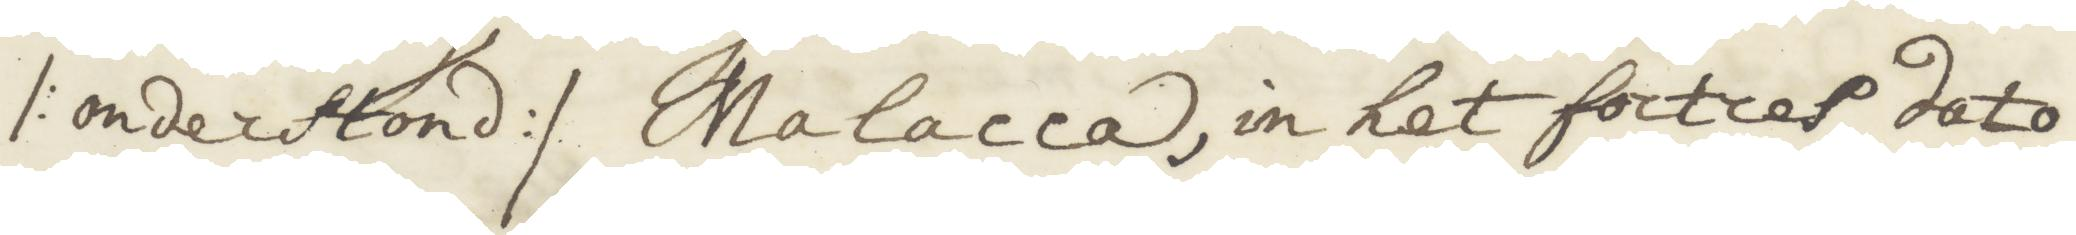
/:onderstond:/ Malacca, in het forties dato
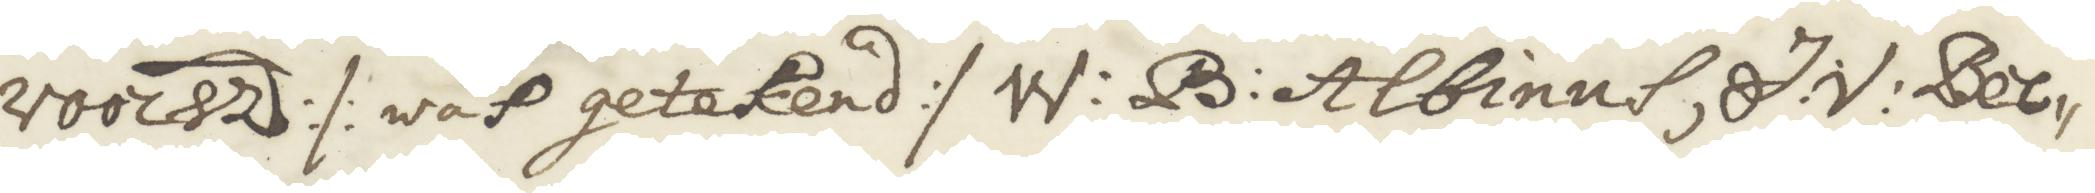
voorsz :/: was getekend :/ W: B: Albinus, J: V: Ber„
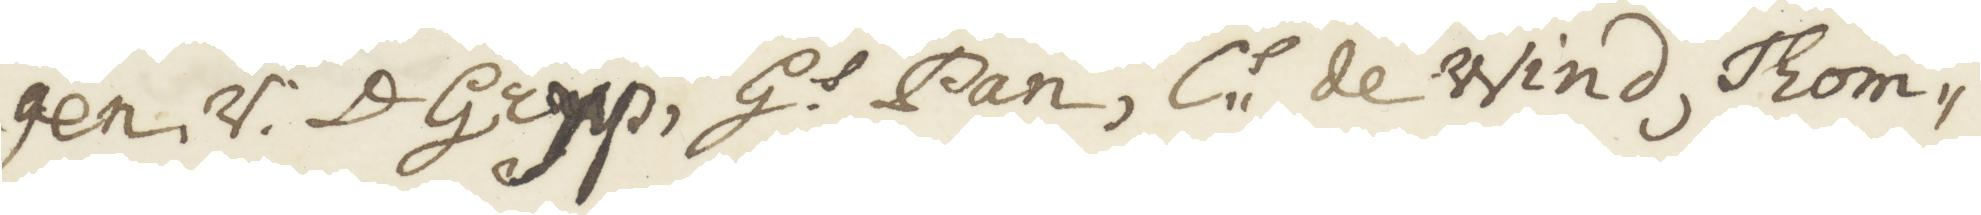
gen, V: D Gryp, G.s Pan, C„s de wind, Rom„s
